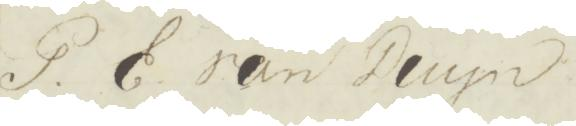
P: E. van Duyn
